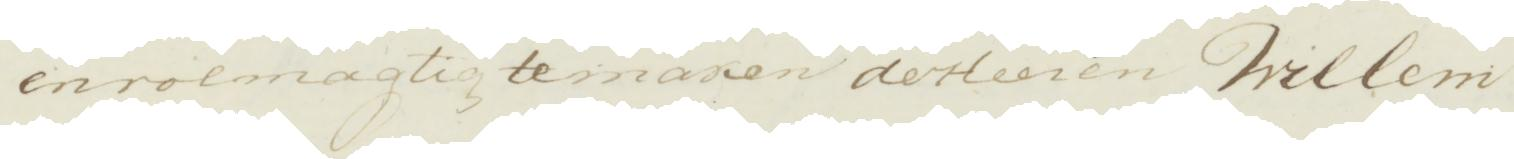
en volmagtig te maken de Heeren Willem
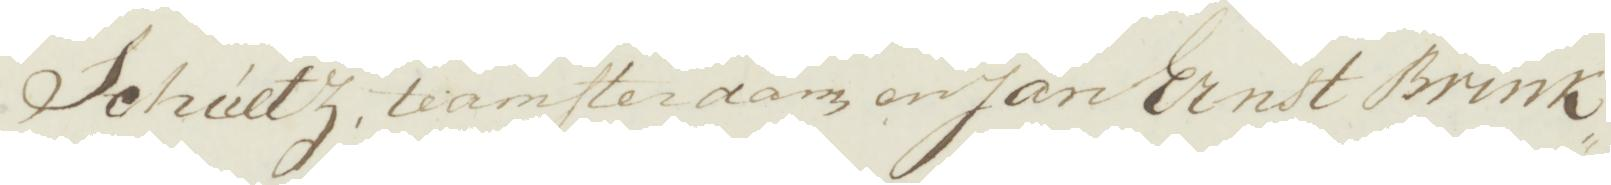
Schultz, te amsterdam, en Jan Ernst Brink„
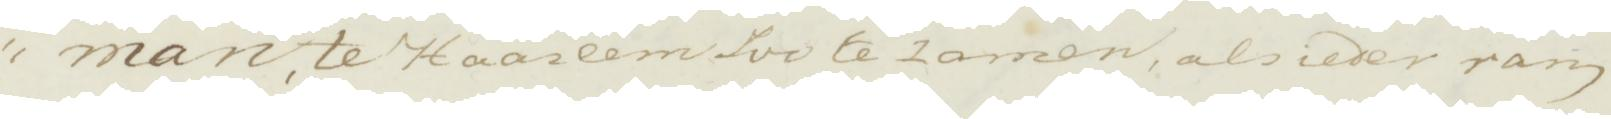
„man, te Haarlem soo te zamen, als ieder van
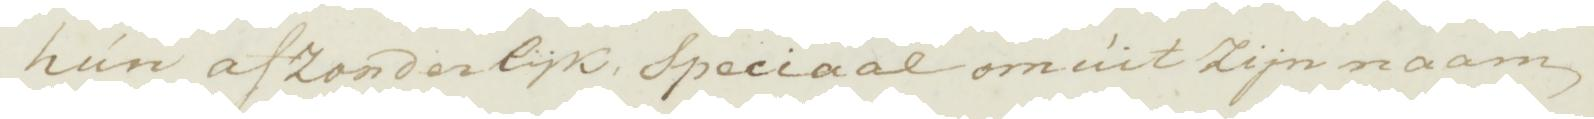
hun afzonderlijk, speciaal om uit zijn naam,
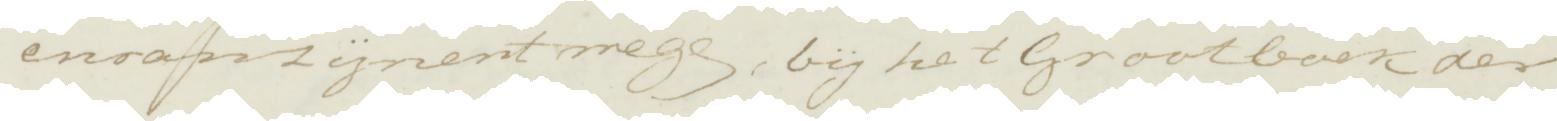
en van zijnentwegen, bij het Grootboek der
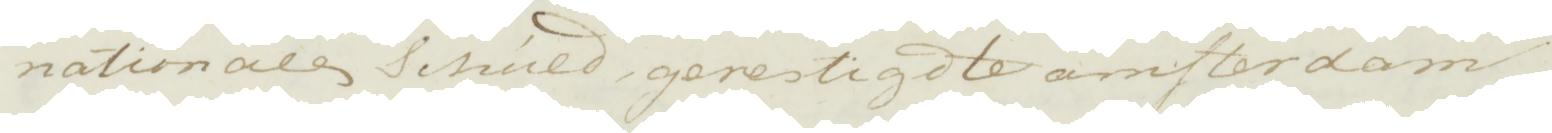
nationale schuld, gevestigd te amsterdam
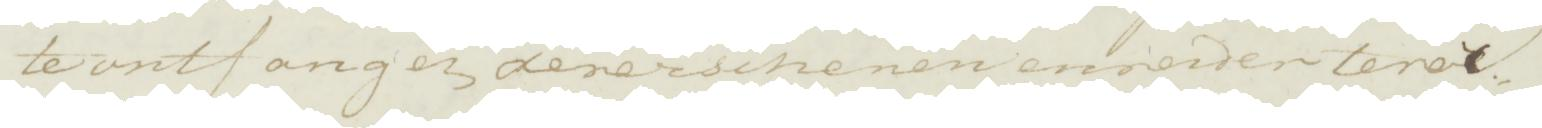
te ontfangen de verschenen en verder te ver„
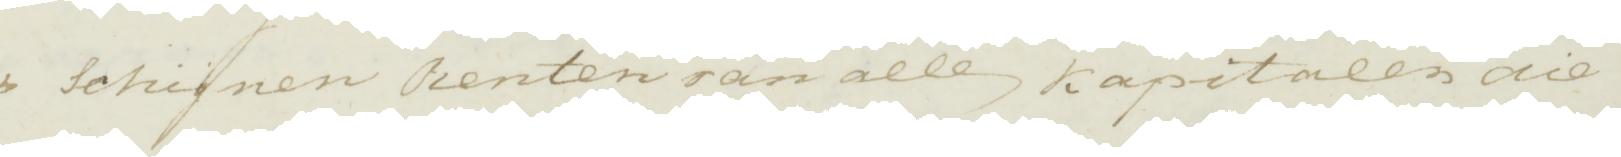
schijnen Renten van allen kapitalen die
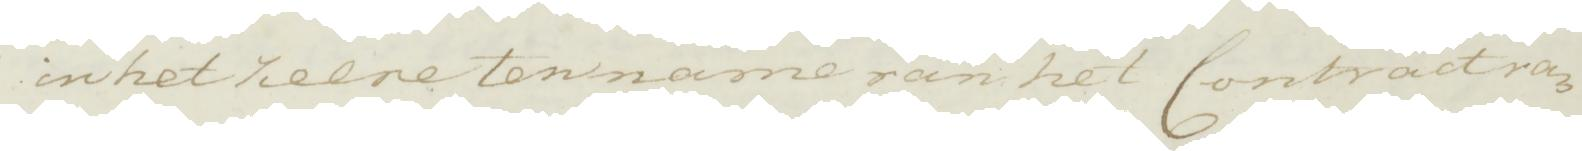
in het zelve ten name van het Contract van
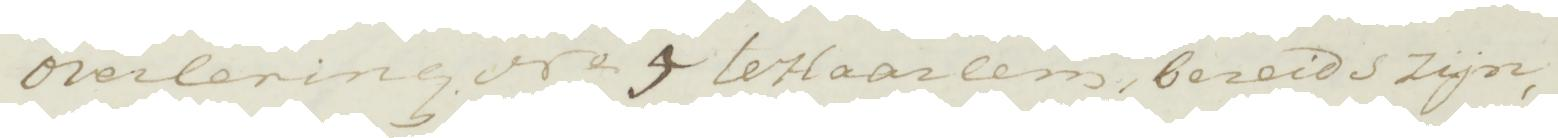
overleving N-o 4 te Haarlem, bereids zijn,
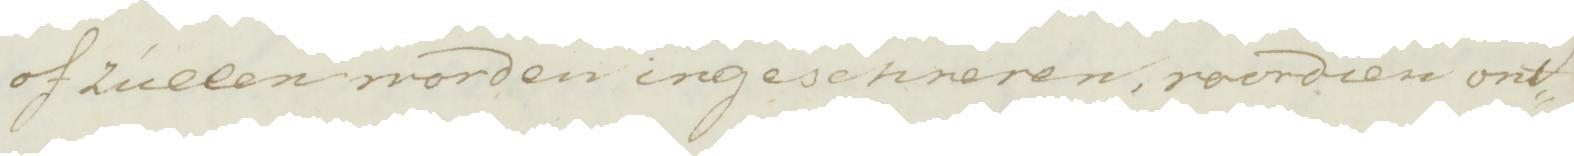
of zullen worden ingeschreven, voordien ont„
